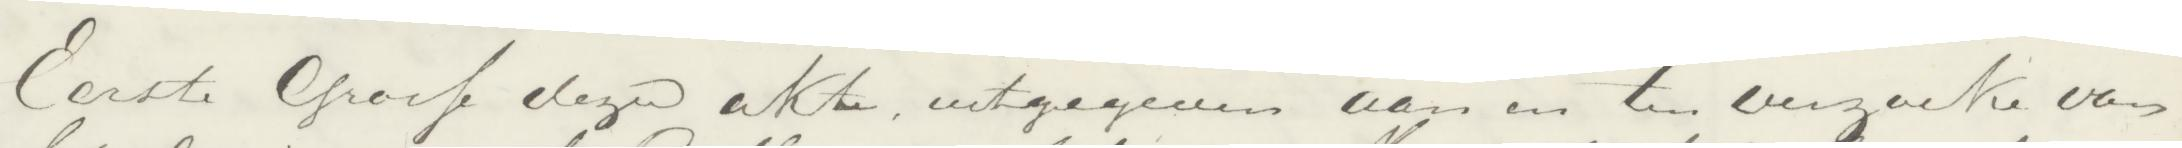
Eerste Grosse dezer akte, uitgegeven aan en ten verzoeke van
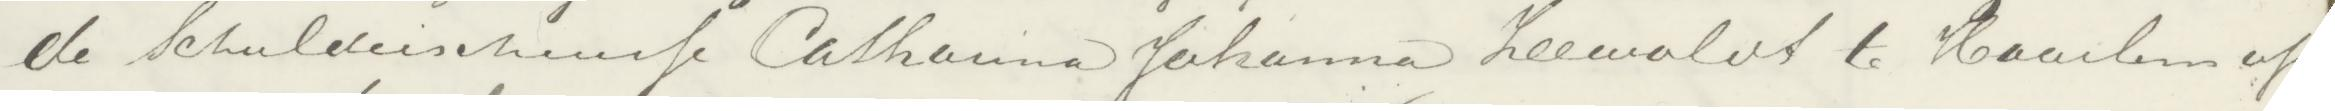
de schuldeischeresse Catharina Johanna Zeewaldt te Haarlem op
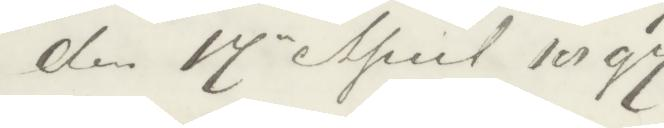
den 17' April 1897
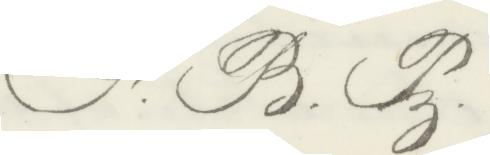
P. B. Pz.
